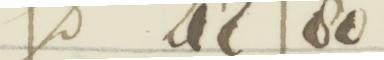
ƒ 47 80
